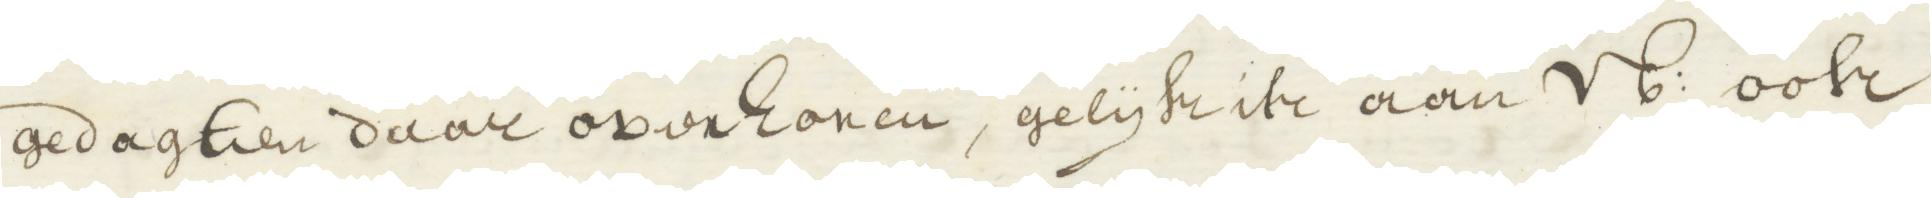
gedagten daar overhoren, gelijk ik aan VE: ook
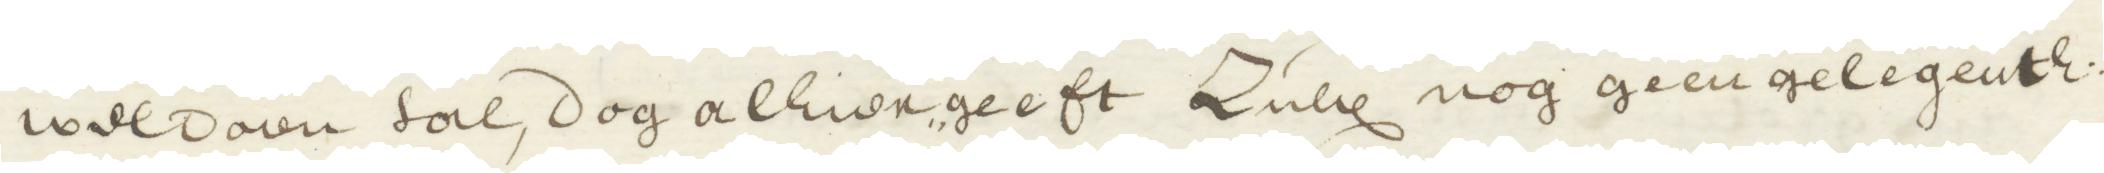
weldoen sal, dog alhier „ geeft zulx nog geen gelegenth:t
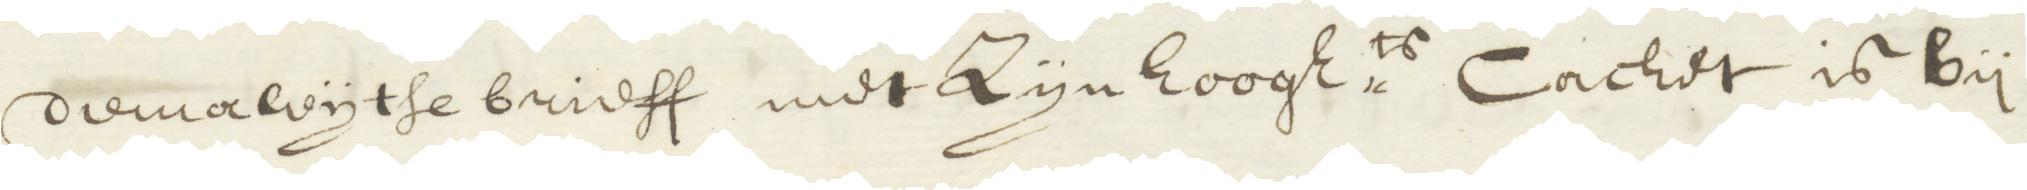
demaleijtse brieff met zijn hoogh„ts Cachet is bij
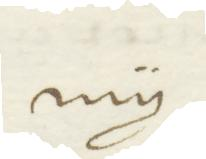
mij
